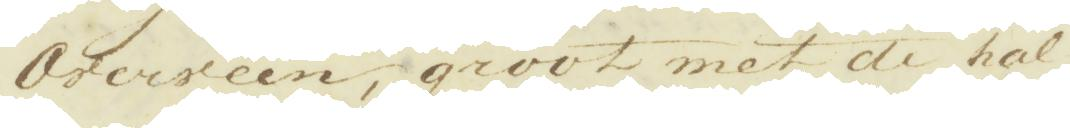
Overveen, groot met de hal
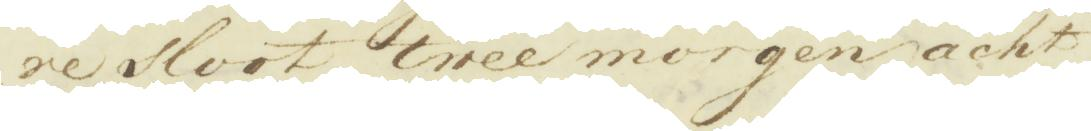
ve sloot twee morgen acht
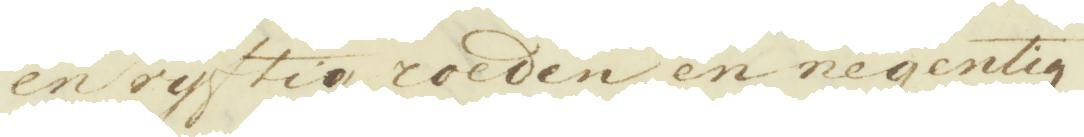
en vyftig roeden en negentig
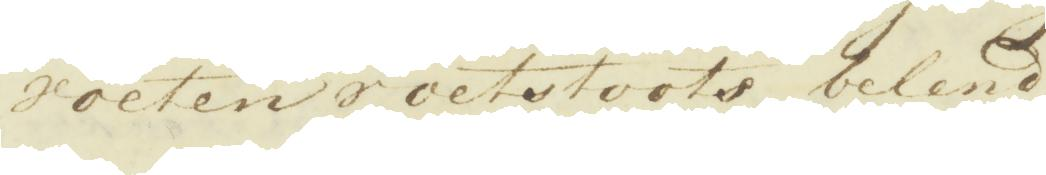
voeten voetstoots, belend
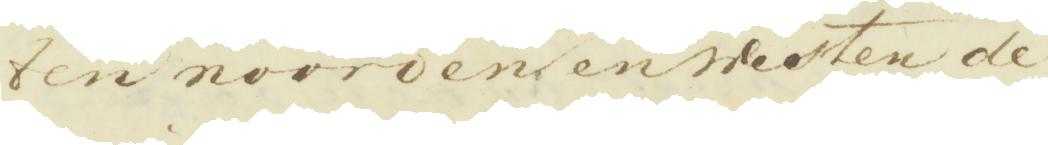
ten noorden en westen de
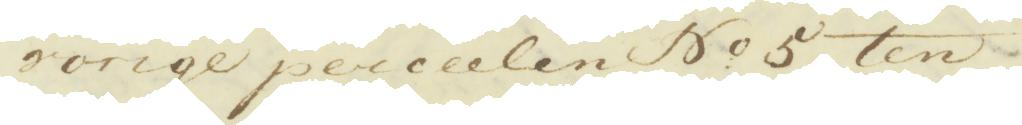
vorige perceelen N:o 5, ten
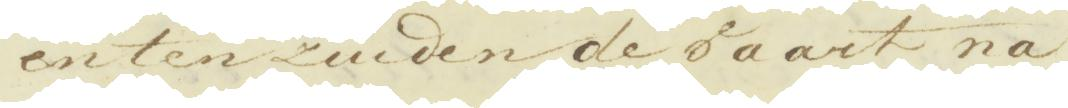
en ten zuiden de vaart na
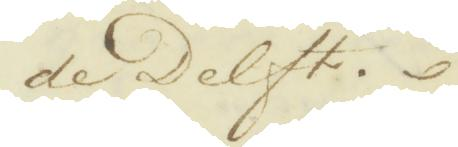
de Delft. —
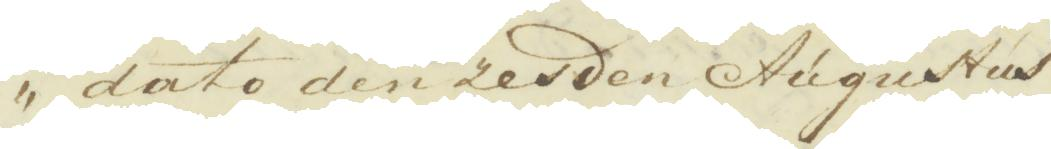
„ dato den zesden Augustus
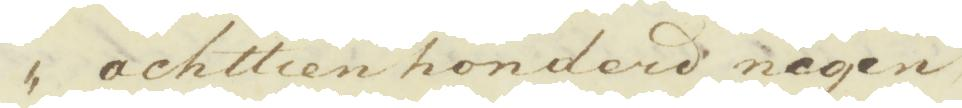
„ achttien honderd negen
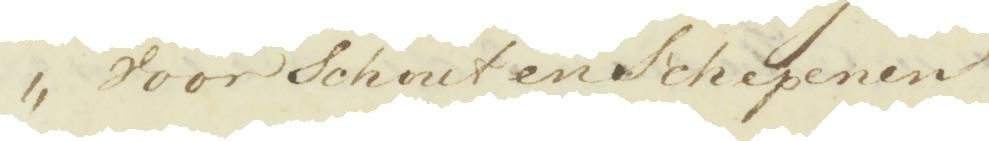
„ Voor schout en Schepenen
